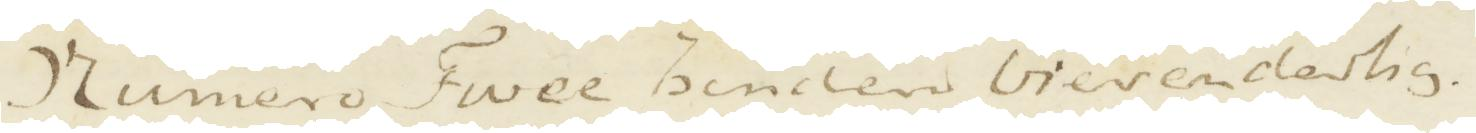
Numero Twee honderd Vier en dertig.
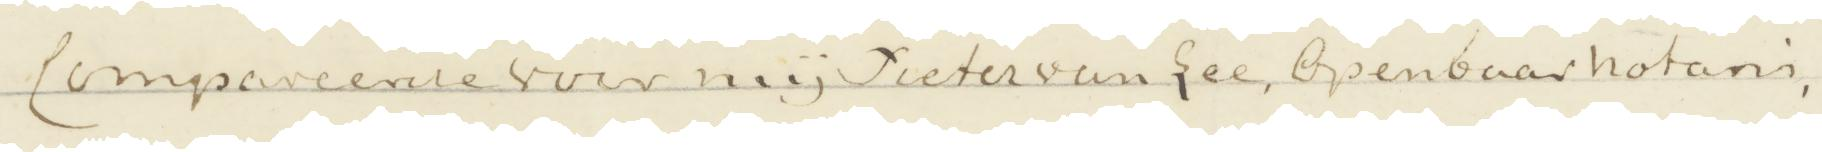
Compareerde voor mij Pieter van Lee, Openbaar Notaris,
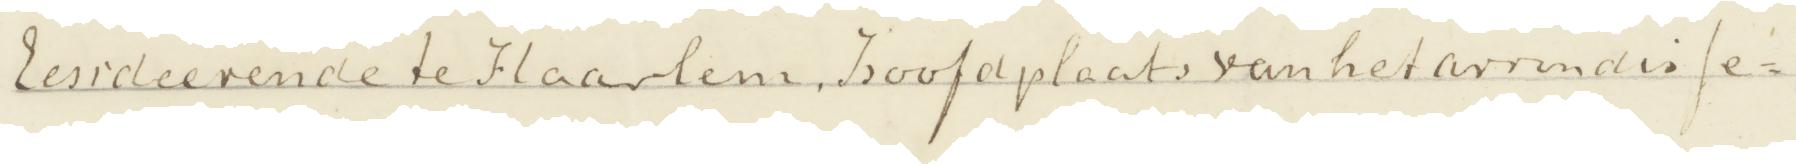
Resideerende te Haarlem, hoofdplaats van het arrondisse„
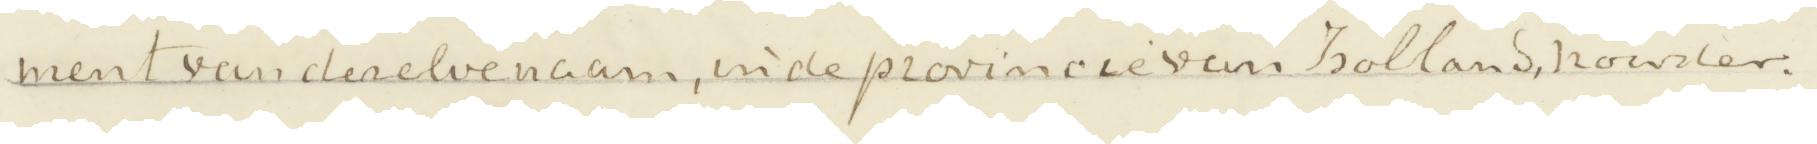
ment van dezelve naam, in de provincie van holland, Noorder,
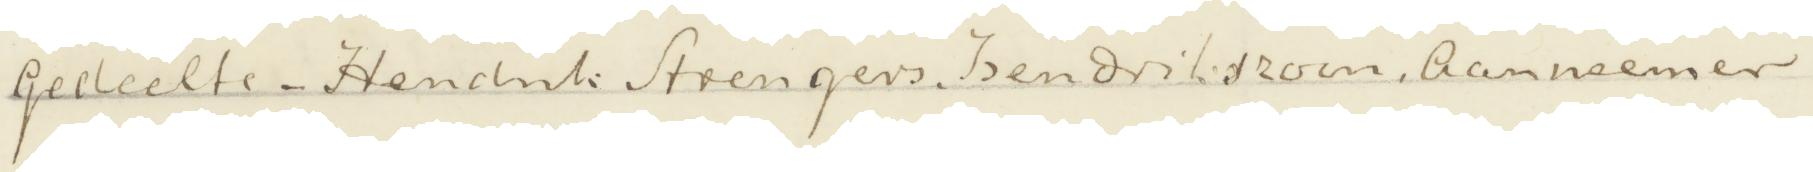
Gedeelte — Hendrik Strengers Hendrikszoon, Aanneemer
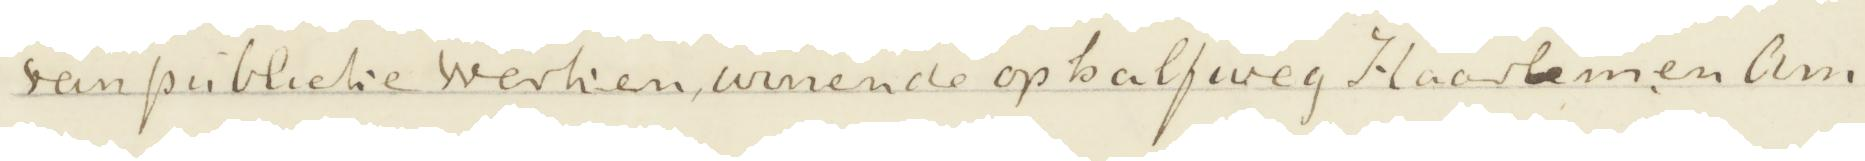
van publieke Werken, wonende op halfweg Haarlem, en Am
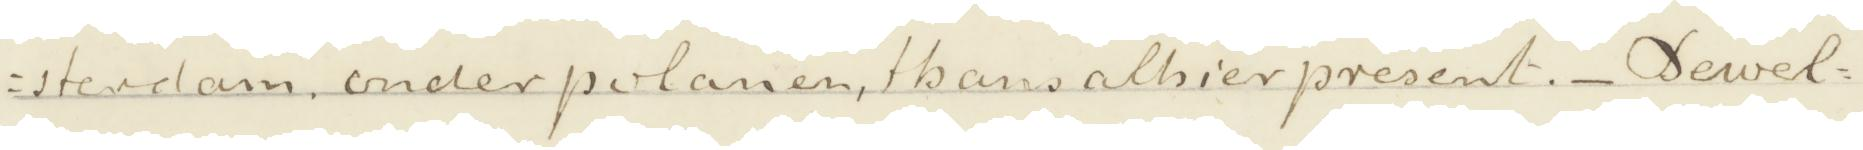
„sterdam, onder polanen, thans alhier present. — Dewel„
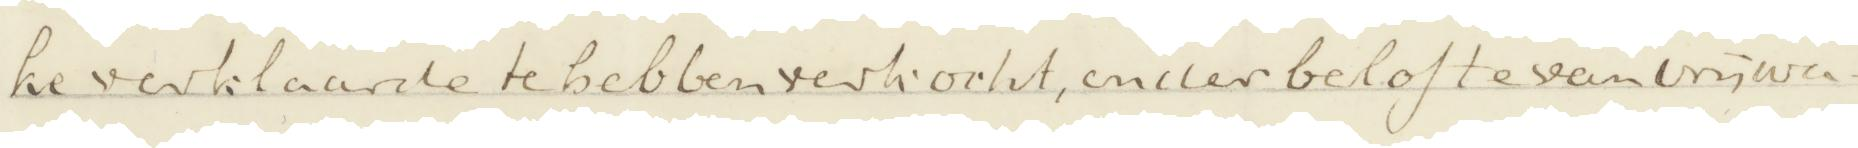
ke verklaarde te hebben verkocht, onder belofte van vrijwa
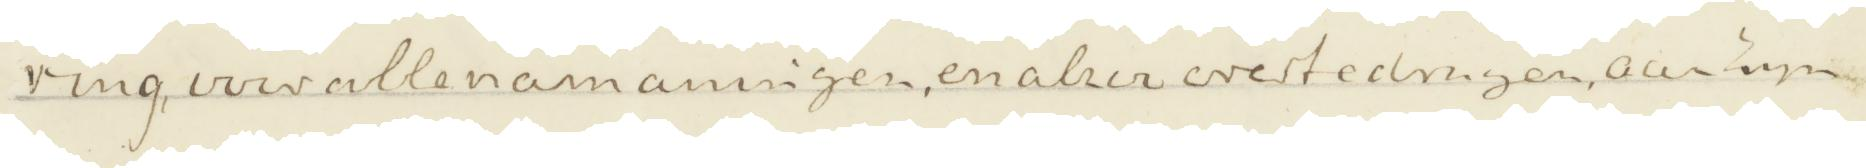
ring, voor alle namaningen, en alzer over te dragen, aan zyn
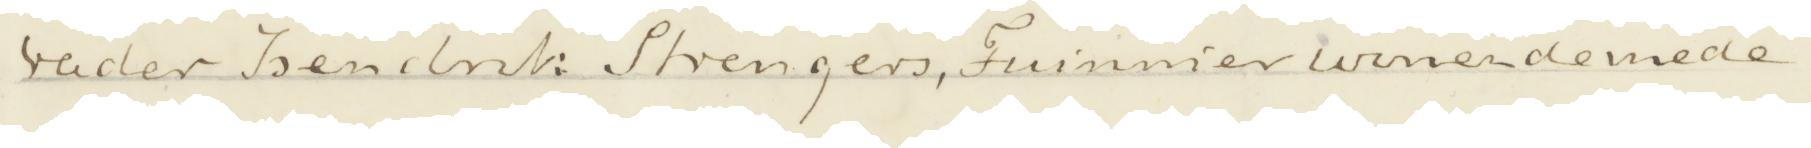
Vader hendrik Strengers, Tuinnier wonende mede
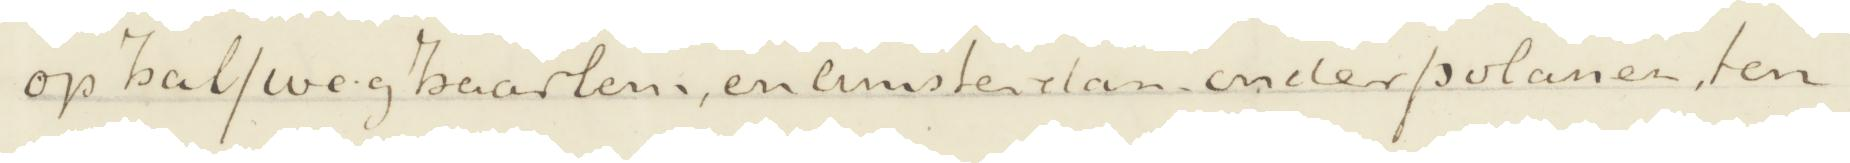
op halfweg haarlem, en Amsterdam onder polanen, ten
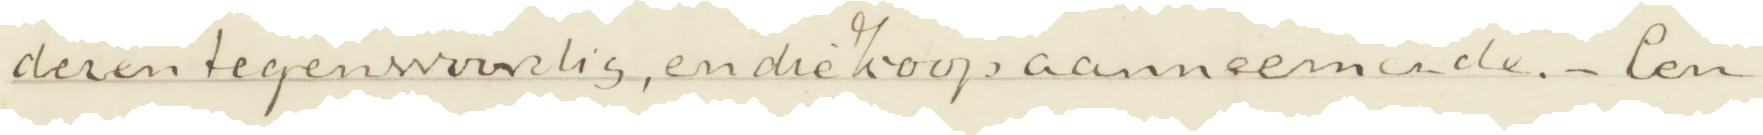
dezen tegenwoordig, en die koop aanneemende. — Een
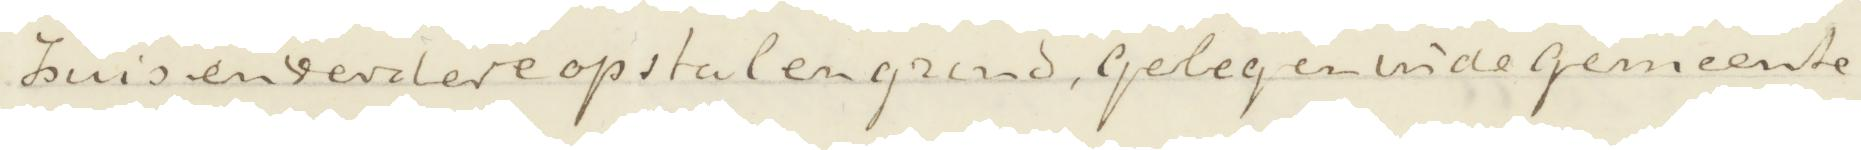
huis en verdere opstal en grond, Gelegen in de Gemeente
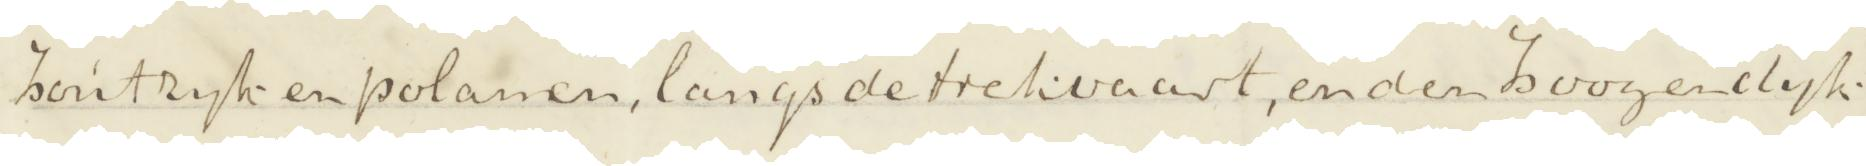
houtryk en polanen, langs de trekvaart, en den hoogendyk
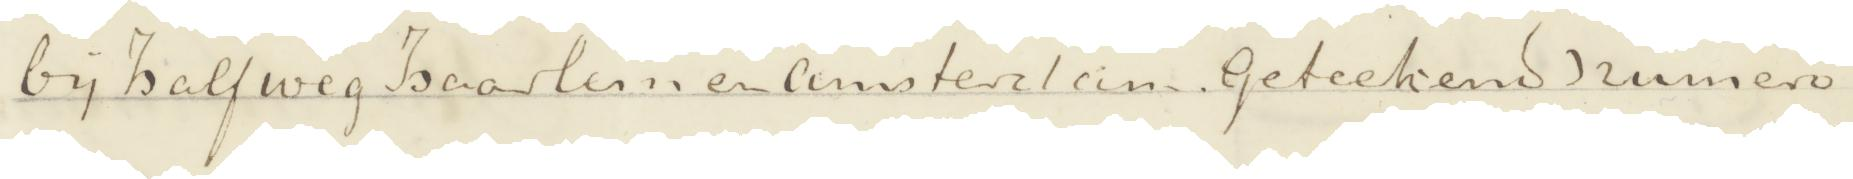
bij halfweg haarlem en Amsterdam. Geteekend Numero
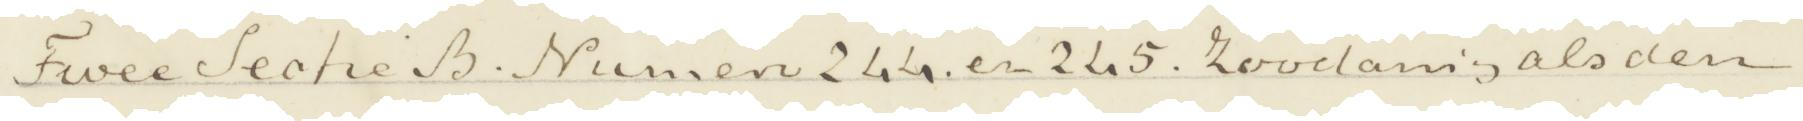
Twee Sectie B. Numero 244, en 245. Zoodanig als den
